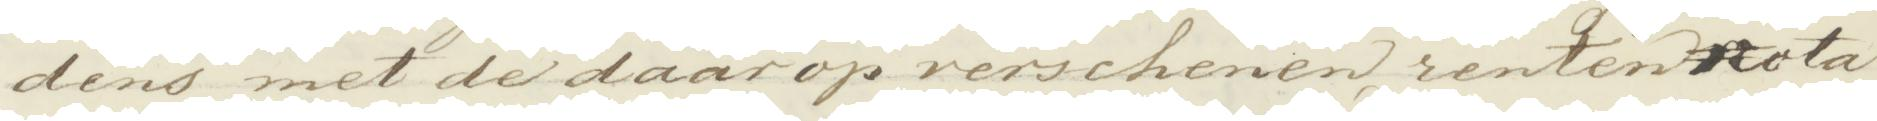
dens met de daarop verschenen renten Nota
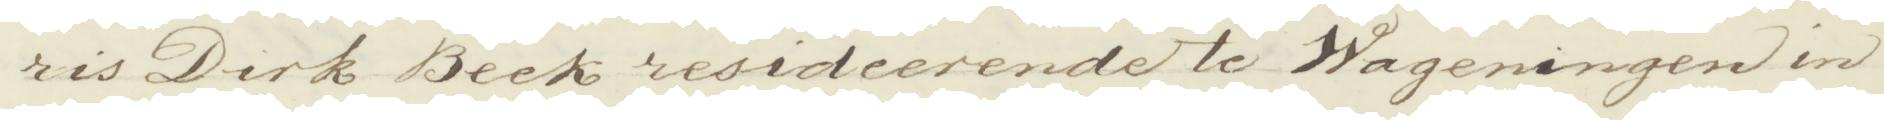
ris Dirk Beek resideerende te Wageningen in
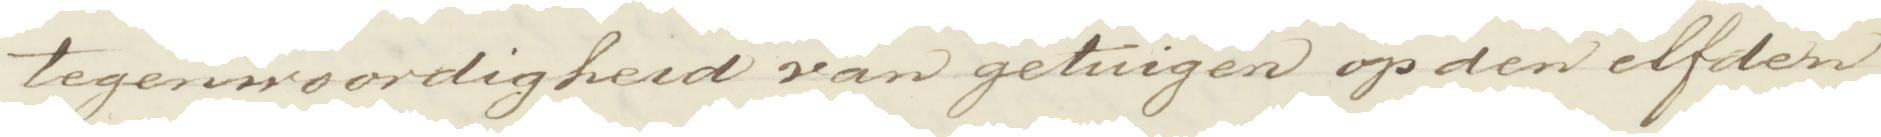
tegenwoordigheid van getuigen op den elfden
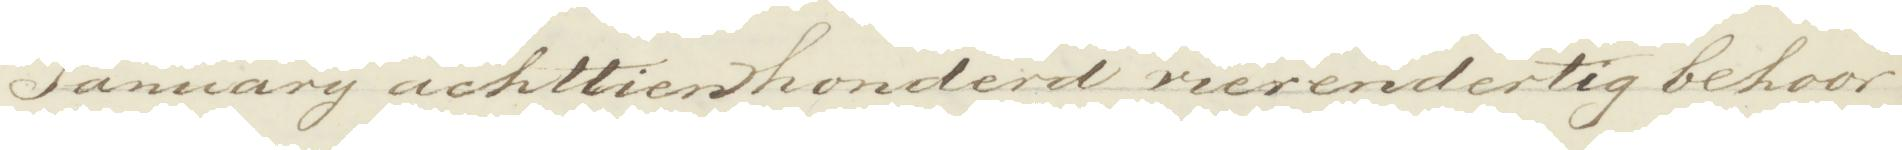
Ianuarij achttienhonderd vierendertig behoor
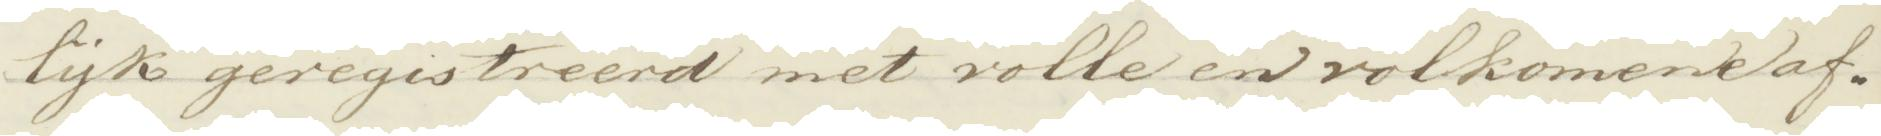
lijk geregistreerd met volle en volkomene af„
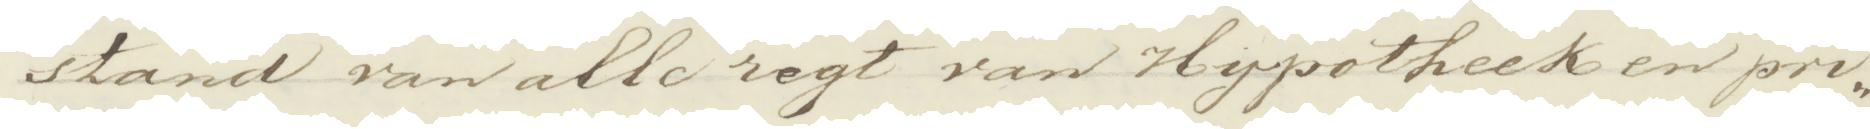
stand van alle regt van Hijpotheek en pri„
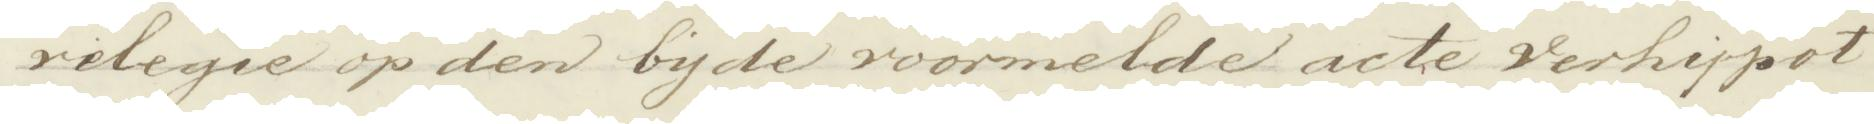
vilegie op den bij de voormelde acte verhijpot
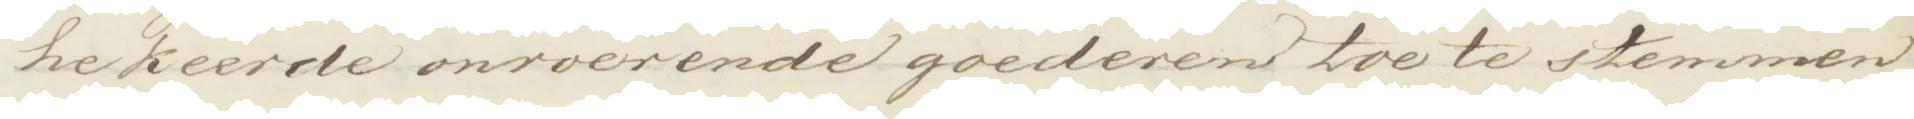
hekeerde onroerende goederen toe te stemmen
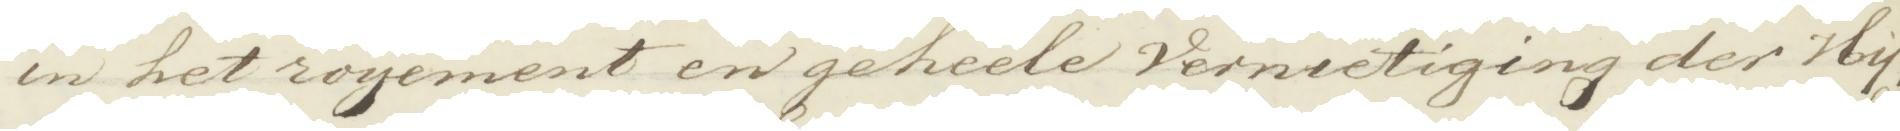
in het roijement en geheele Vernietiging der Hij
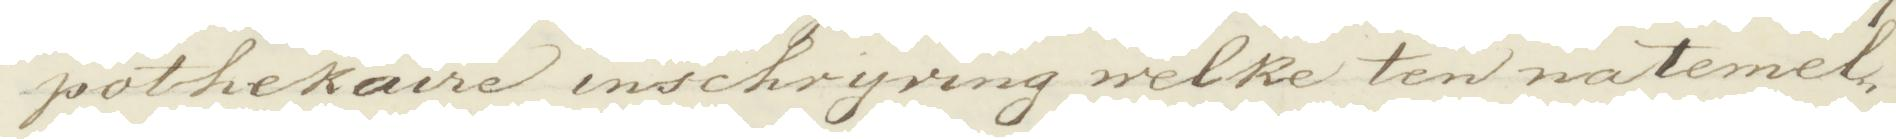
pothekaire inschrijving welke ten natemel„
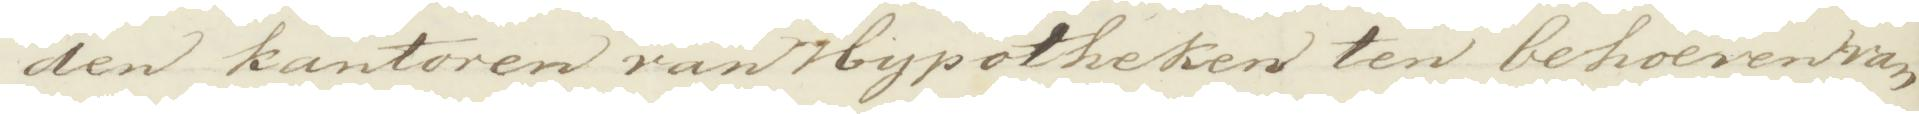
den kantoren van Hijpotheken ten behoeven van
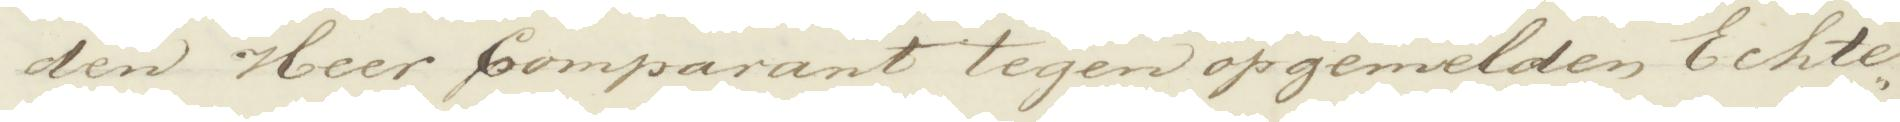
den Heer Comparant tegen opgemelden Echte„
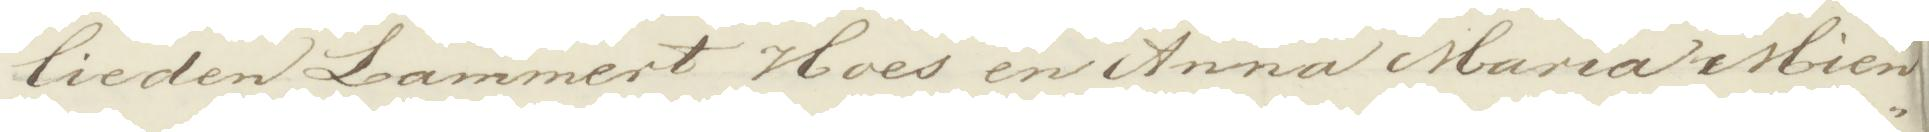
lieden Lammert Hoes en Anna Maria Mien„
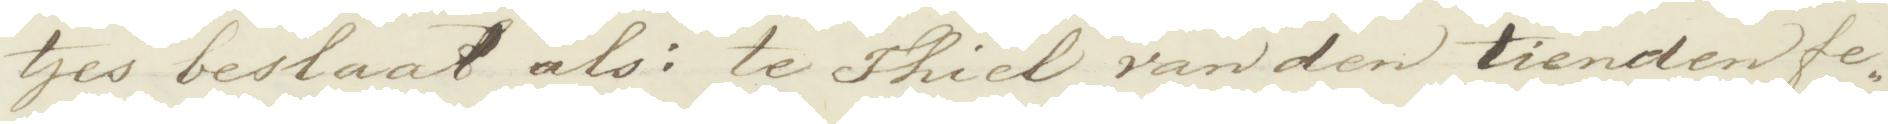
tjes beslaat als: te Thiel van den tienden fe„
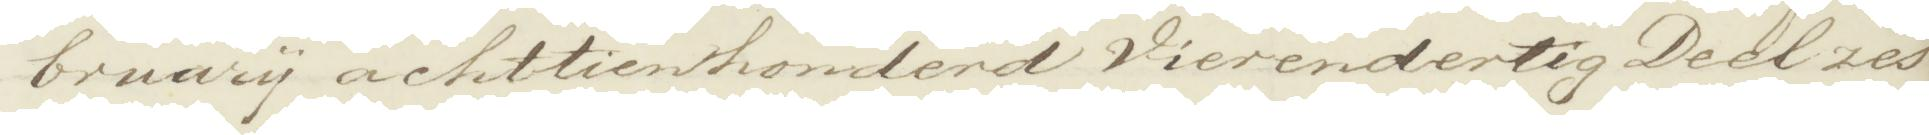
bruarij achttienhonderd Vierendertig Deel zes
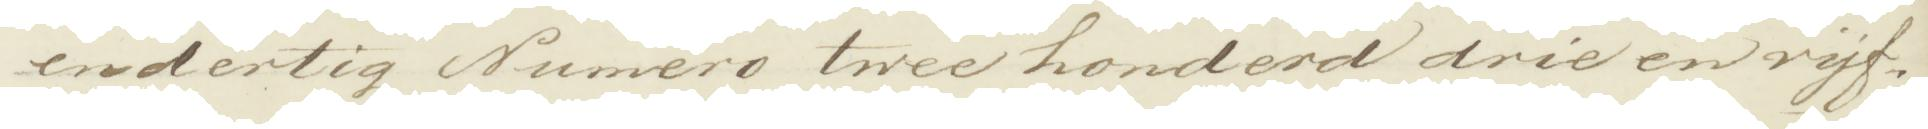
en dertig Numero twee honderd drie en vijf„
